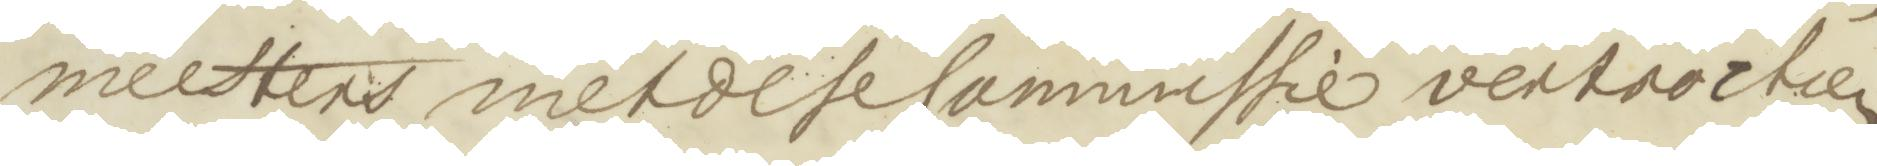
meesters met dese Commissie vertrocken
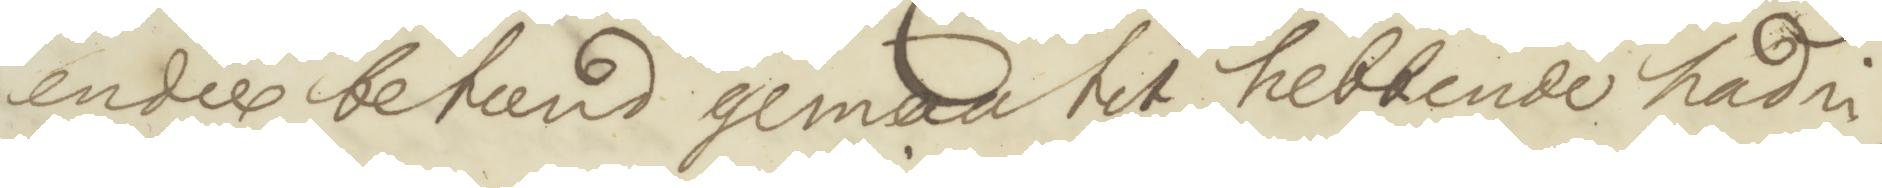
en die bekend gemaakt hebbende had in
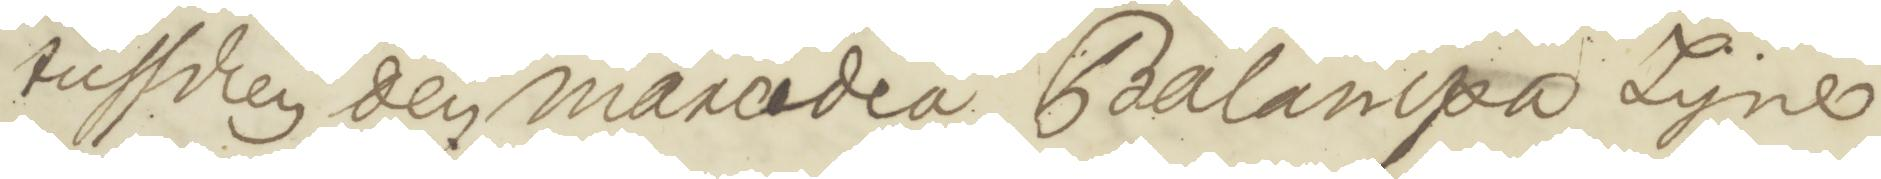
tusschen den maradia Balanipa zijne
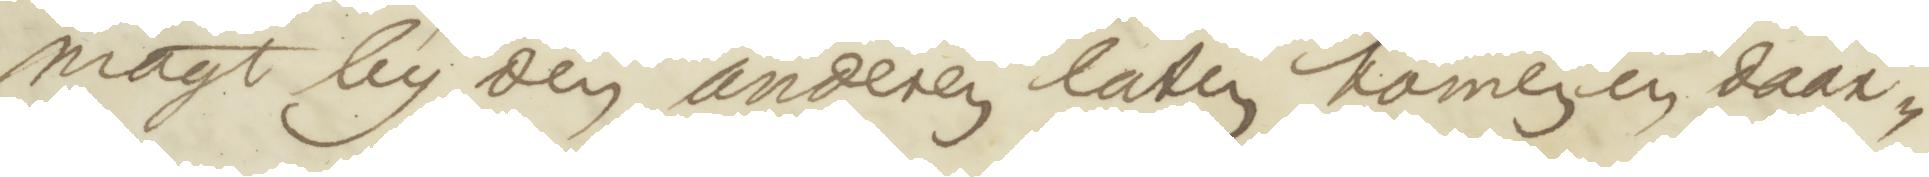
magt bij den anderen laten komen en daar„
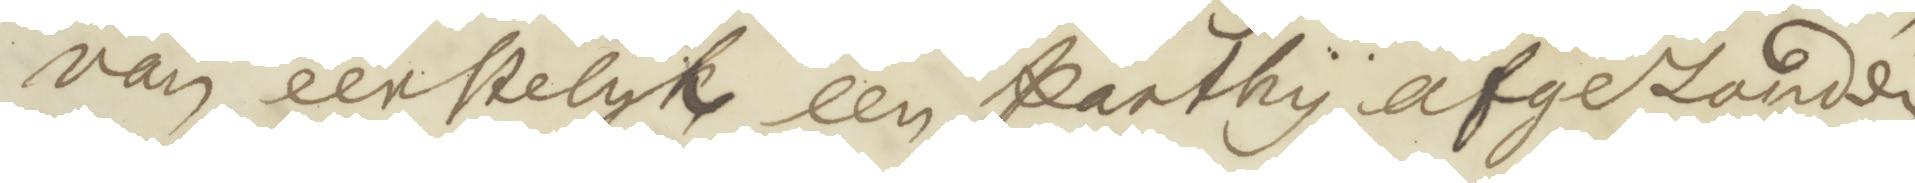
van eerstelijk een parthij afgezonden
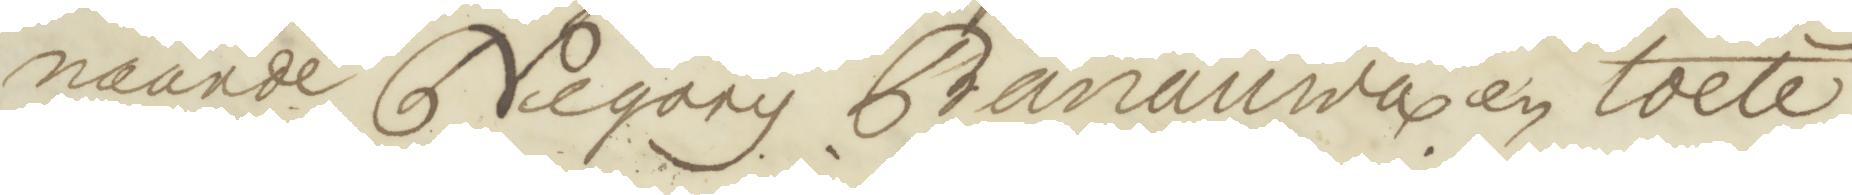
naarde Negorij Banauwa en toete
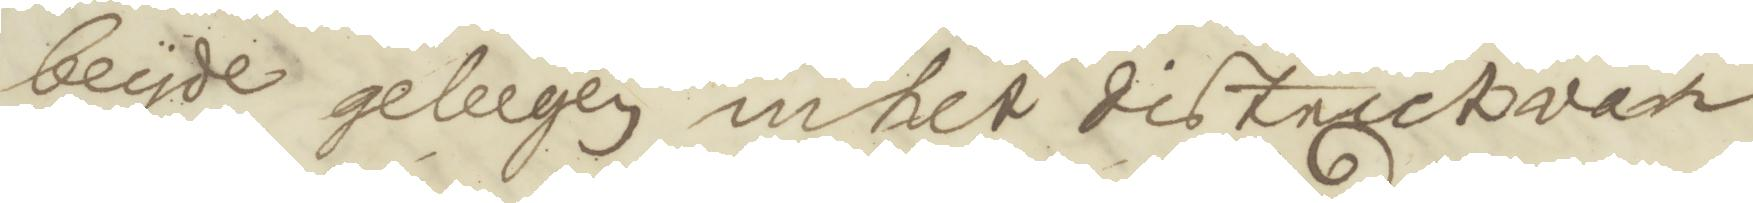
beijde geleegen in het district van
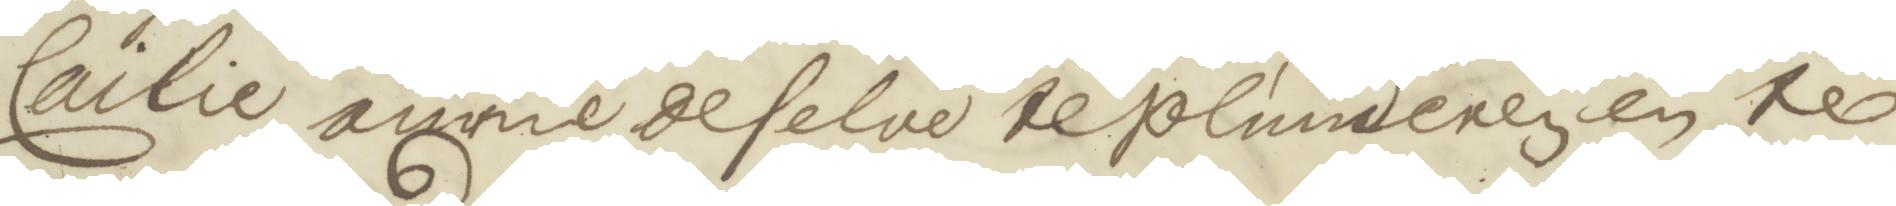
Cailie omme deselve te plunderen en te
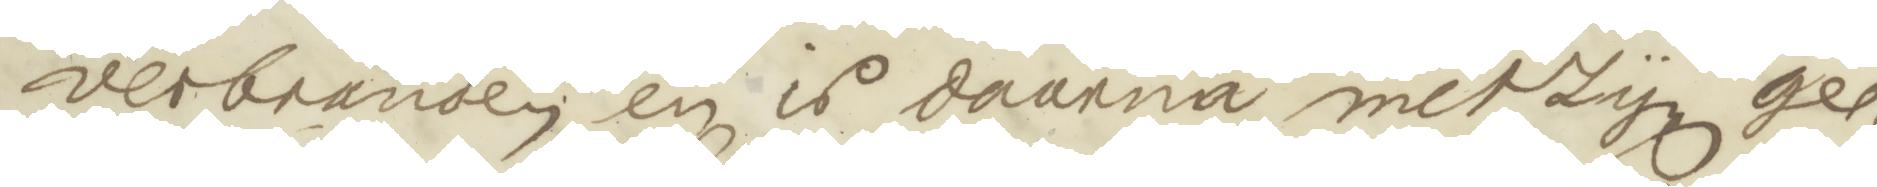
verbranden en is daarna met zijn ge
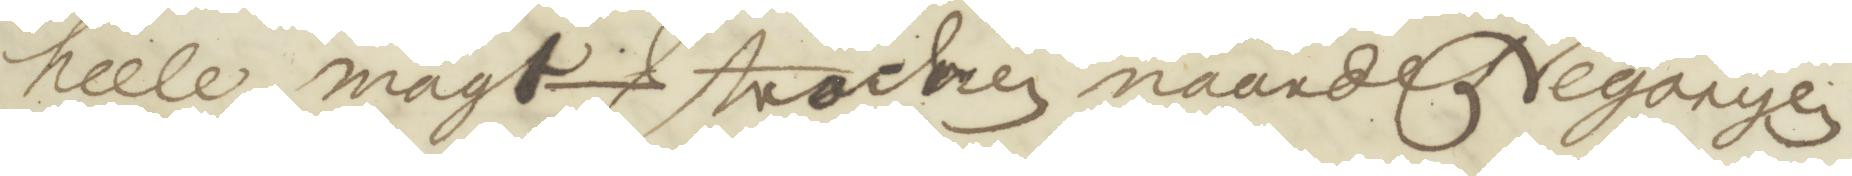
heele magt vertrocken naar de Negorijen
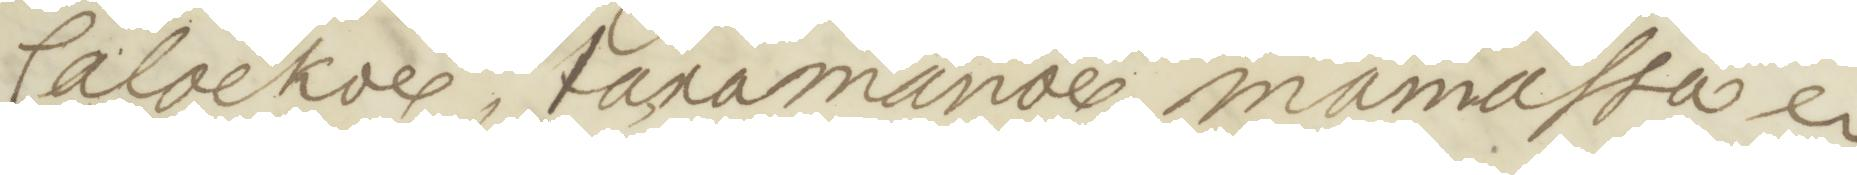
Caloekoe, taramanoe mamassa en
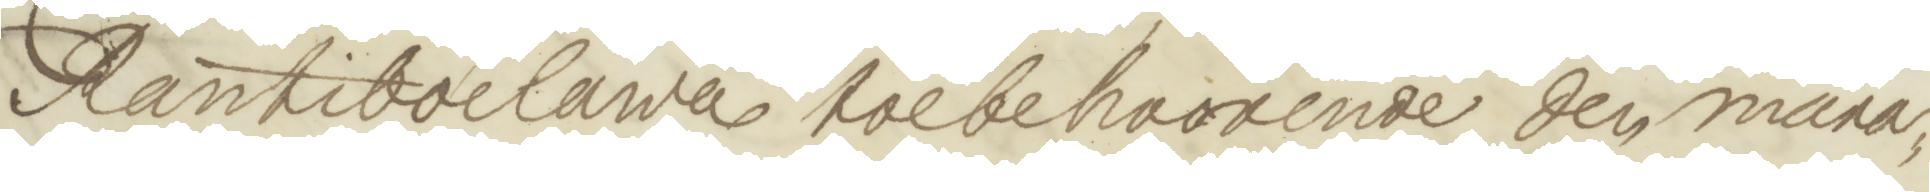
Rantiboelawa toebehoorende den mara„
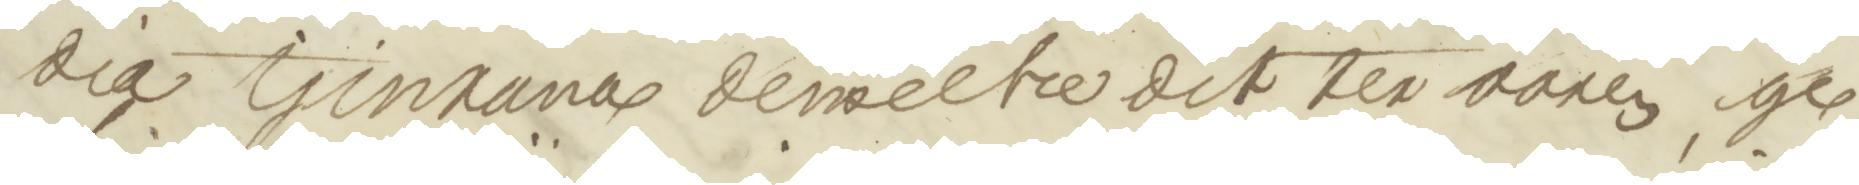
dia tjinrana dewelke dit ter voren ge
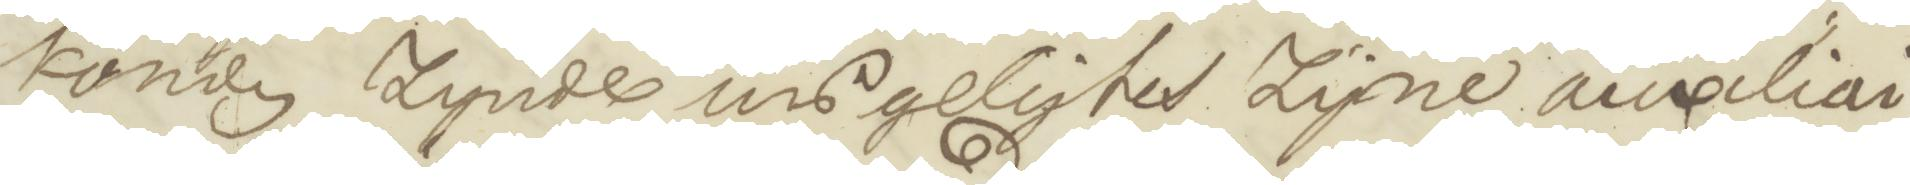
komen zijnde insgelijks zijne auxiliai
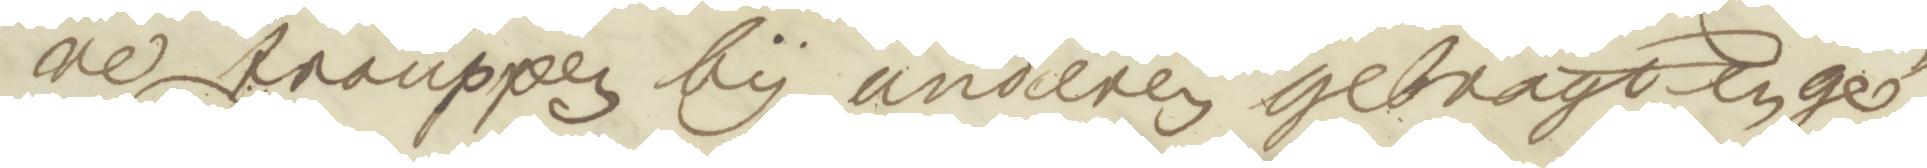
re trouppen bij anderen gebragt en ge
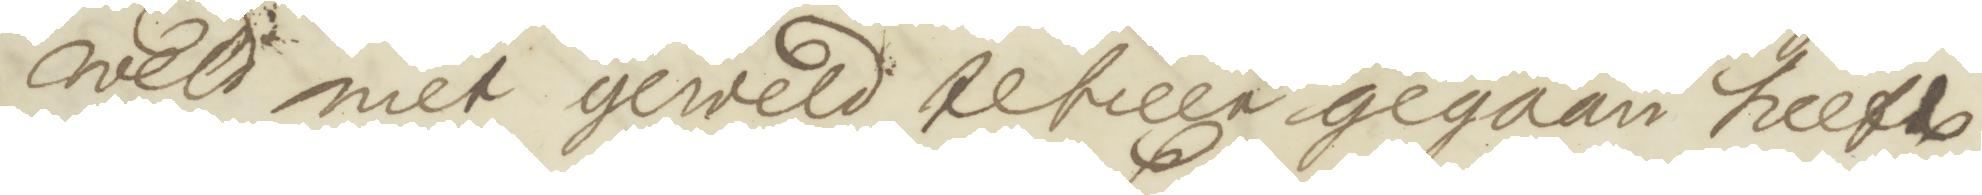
weld met geweld tekeer gegaan heeft
